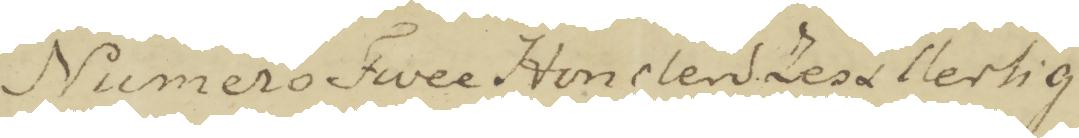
Numero Twee Honderd Zes & Dertig
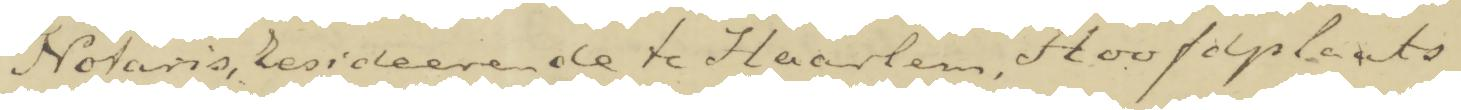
Notaris, Resideerende te Haarlem, Hoofdplaats
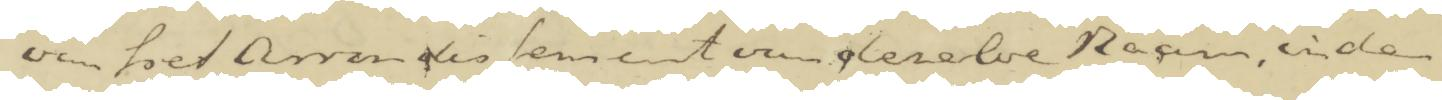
van het Arrondissement van dezelve Naam, in de
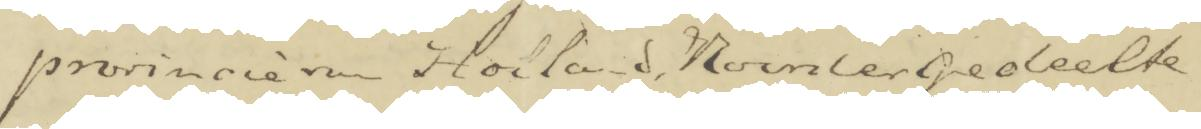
provincie van Holland, Noorder Gedeelte
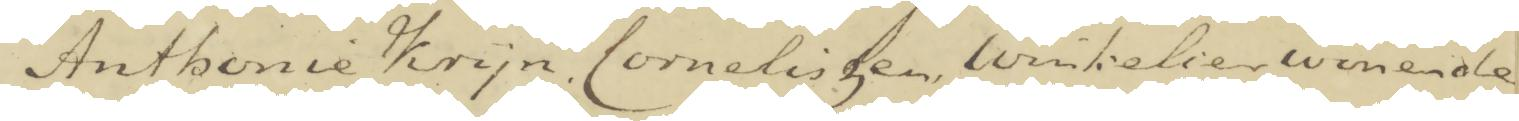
Anthonie Krijn, Corneliszen, winkelier wonende
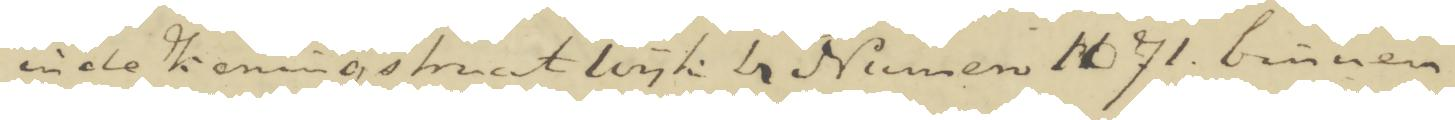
in de Koningstraat wijk 4 Numero 10 71. binnen
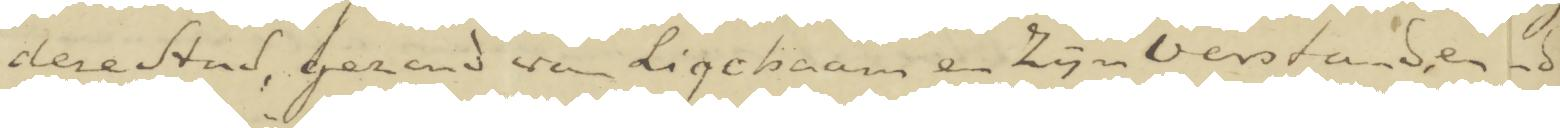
deze Stad, gezond van ligchaam en Zijn verstand en
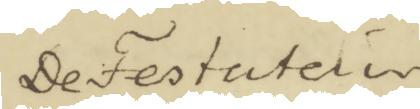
De Testateur
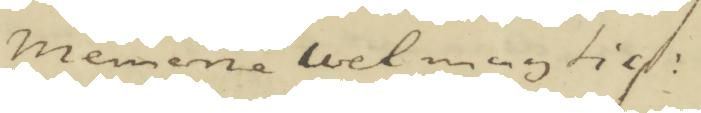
Memorie wel magtig:
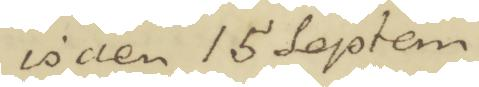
is den 15 septem:
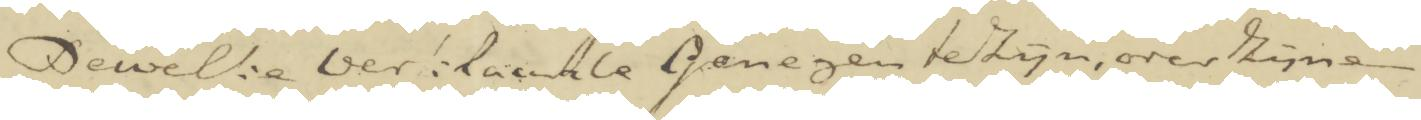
Dewelke verklaarde Genegen te zijn, over zijne
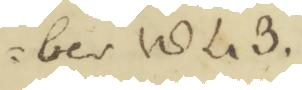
=ber 1843.
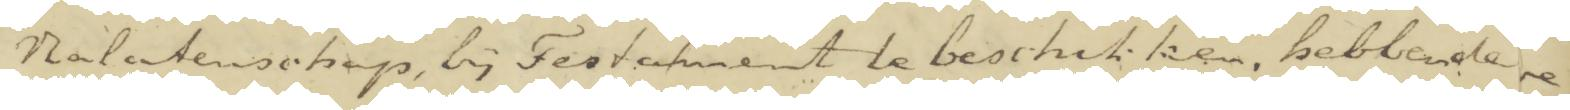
Nalatenschap, bij Testament te beschikken, hebbende
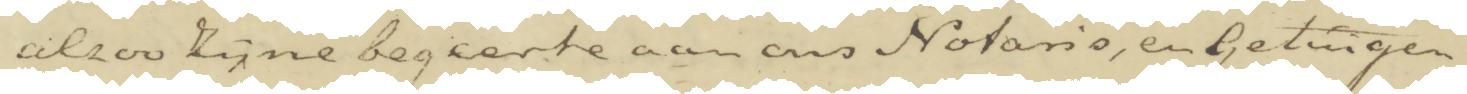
alzoo zijne begeerte aan ons Notaris, en Getuigen
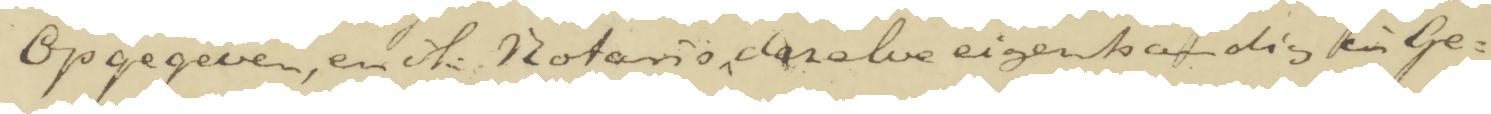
Opgegeven, en ik Notaris, dezelve eigenhandige in Ge=
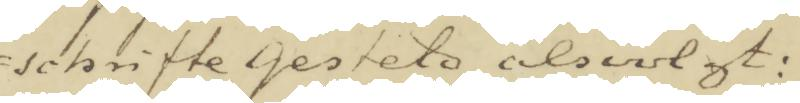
=schrifte gesteld, als volgt:
